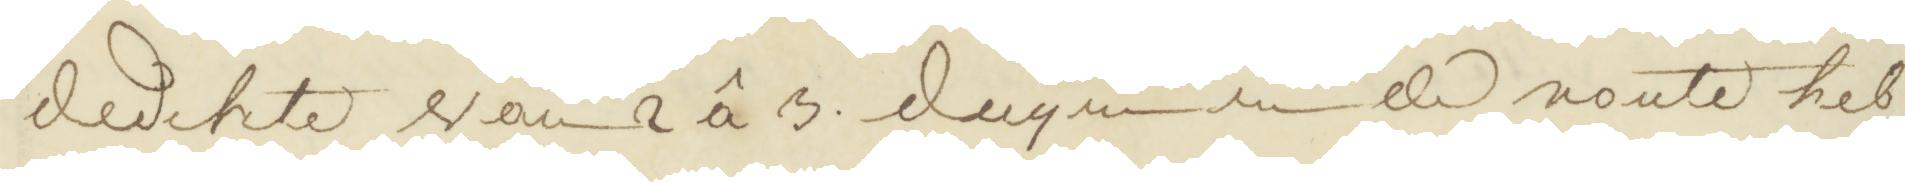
de dikte van 2 â 3. dujm in de ronte heb
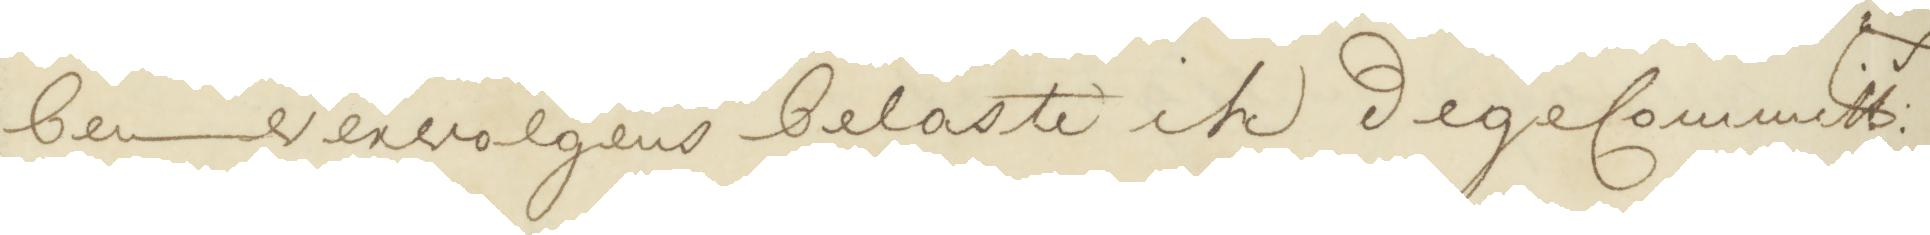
ben vervolgens belaste ik de gecommitt„s
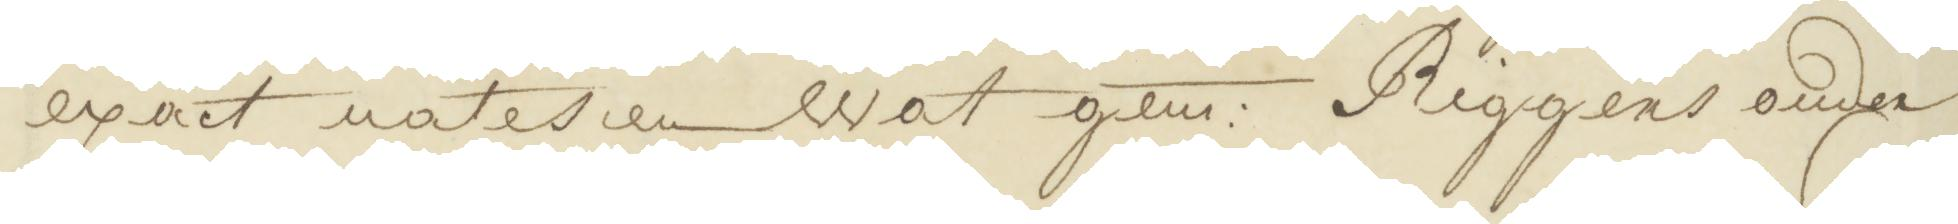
exact na te sien wat gem: Riggers onder
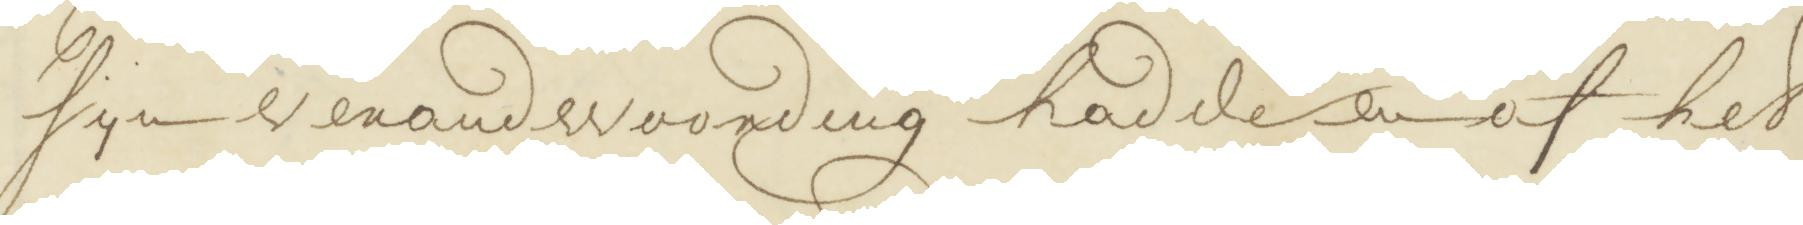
sijn verandwoording hadde en of het
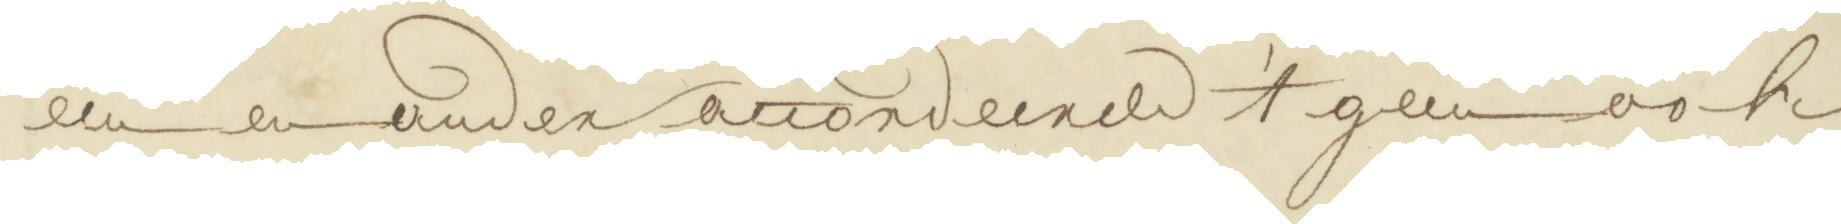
een en ander accordeerde ’t geen ook
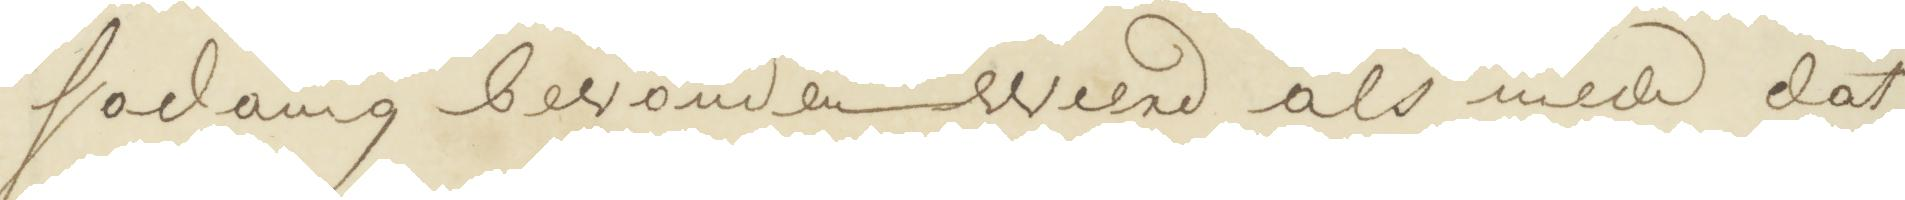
sodanig bevonden wierd, als mede dat
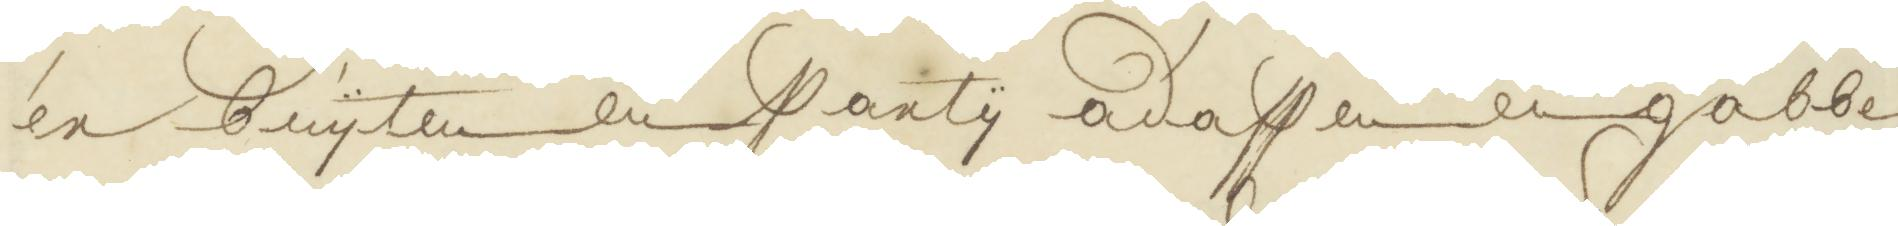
er buijten en partij adappen en gabbe
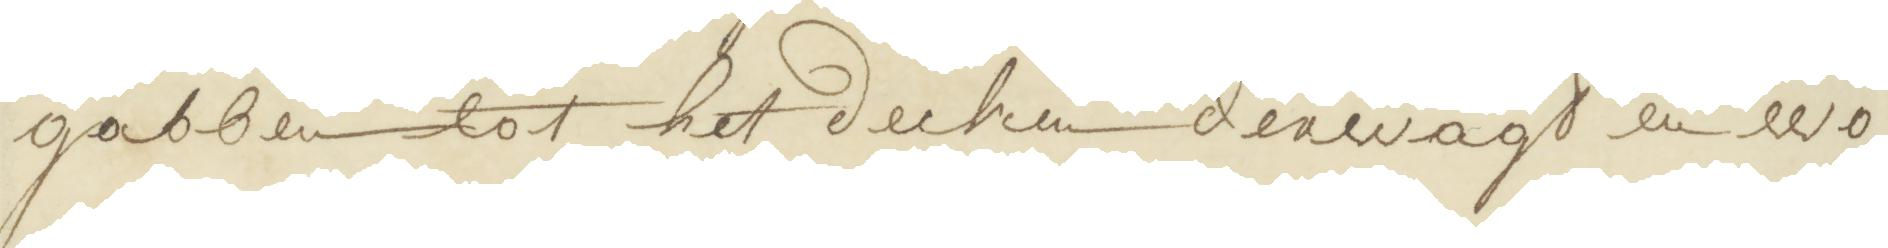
gabben tot het decken der wagt en wo
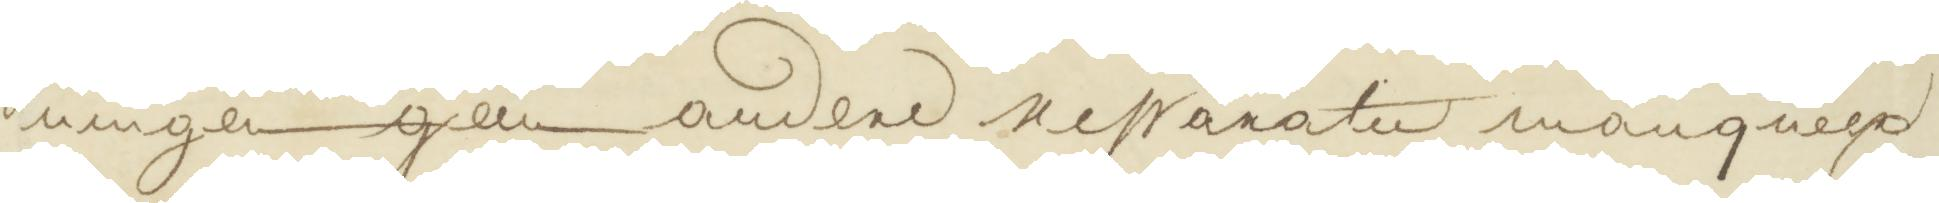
ningen geen andere reparatie manqueer
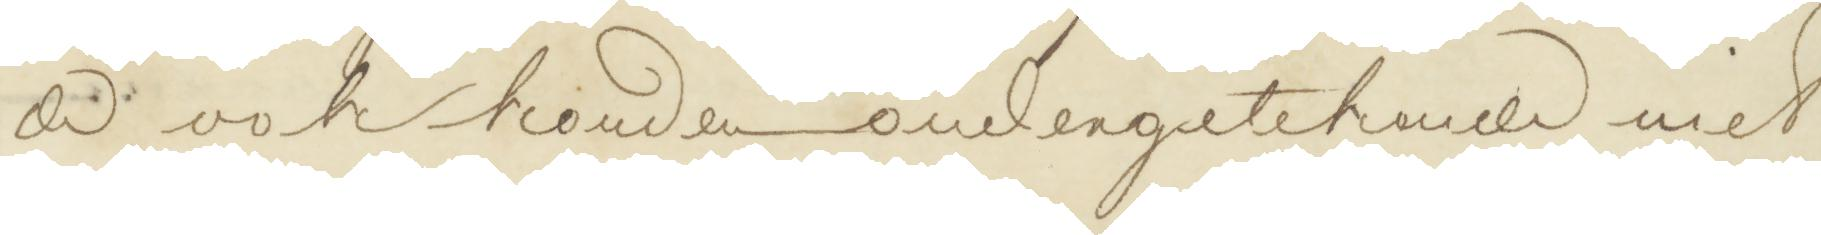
de, ook konden ondergetekende niet
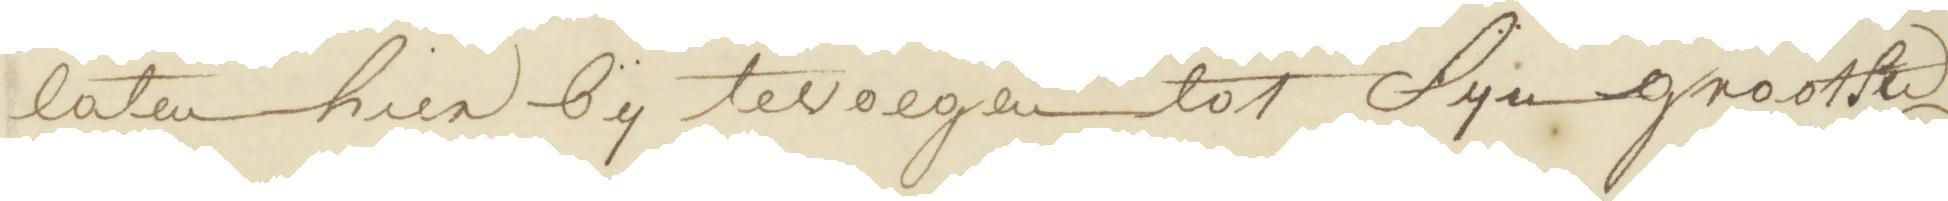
laten hier bij te voegen tot Sijn grootste
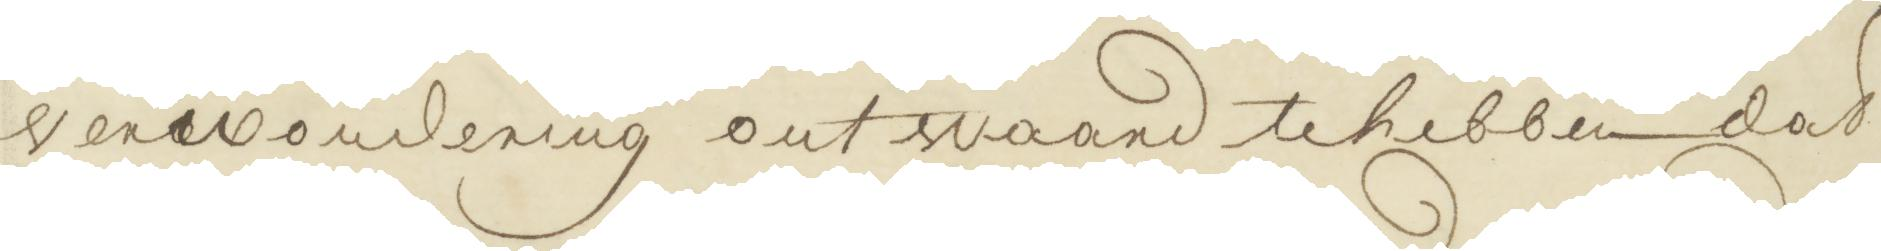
verwondering ontwaard te hebben dat
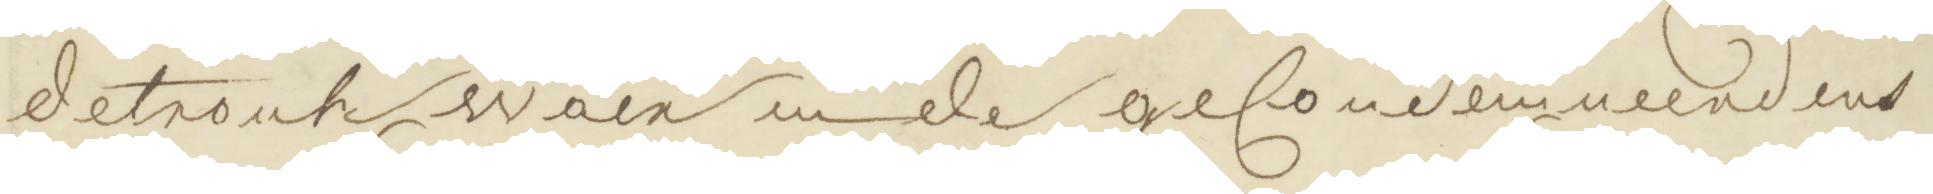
de tronk waer in de gecondemneerdens
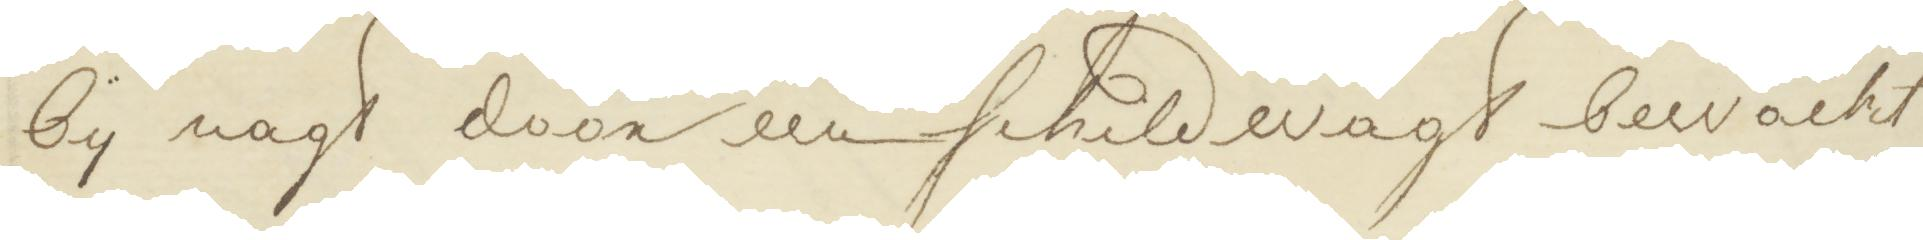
bij nagt door een schildwagt bewaekt
